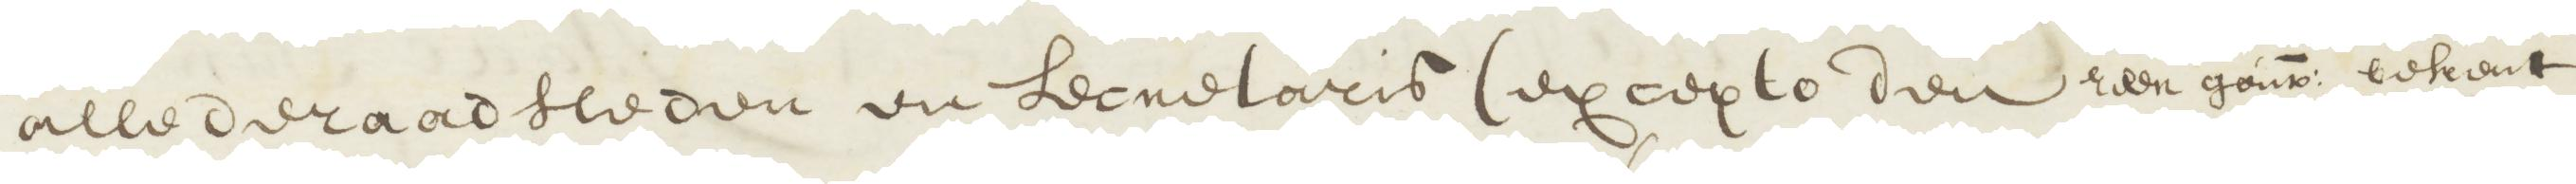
alle de raadsleden en secretaris (excepto den heer gouv:r bekent
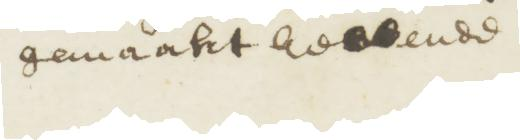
gemaakt hebbende
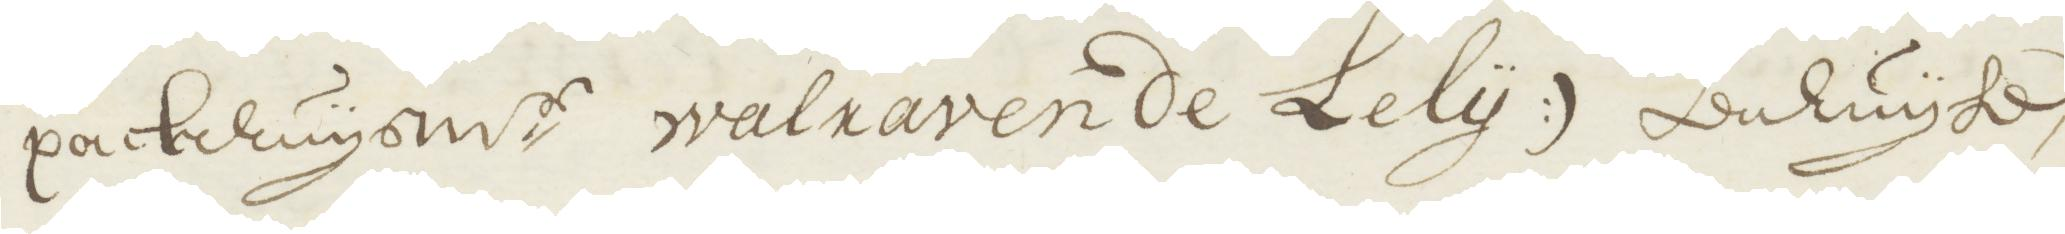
packhuijsm„r walraven de Lelij:) ten huijse,
